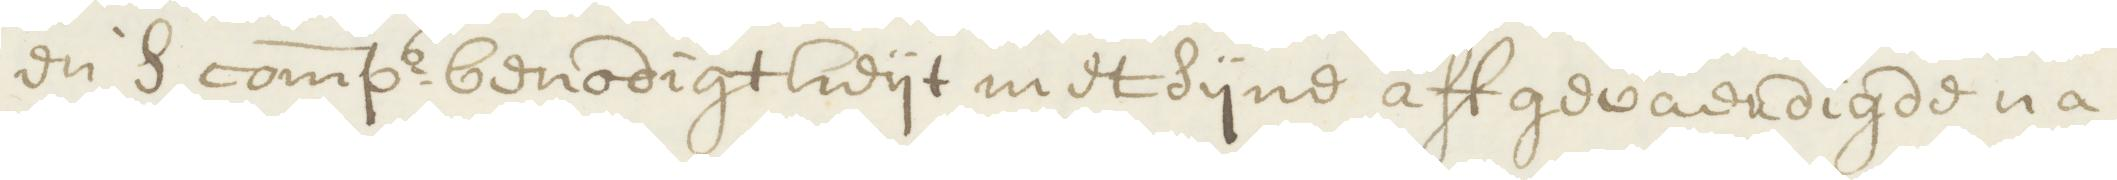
en ’s comp:s benodigtheijt met sijne affgevaerdigde na
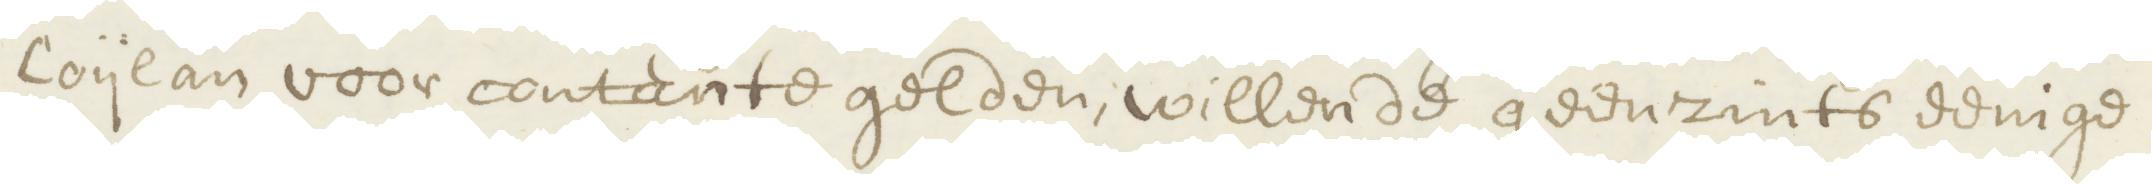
coijlan voor contante gelden, willen de geenzints eenige
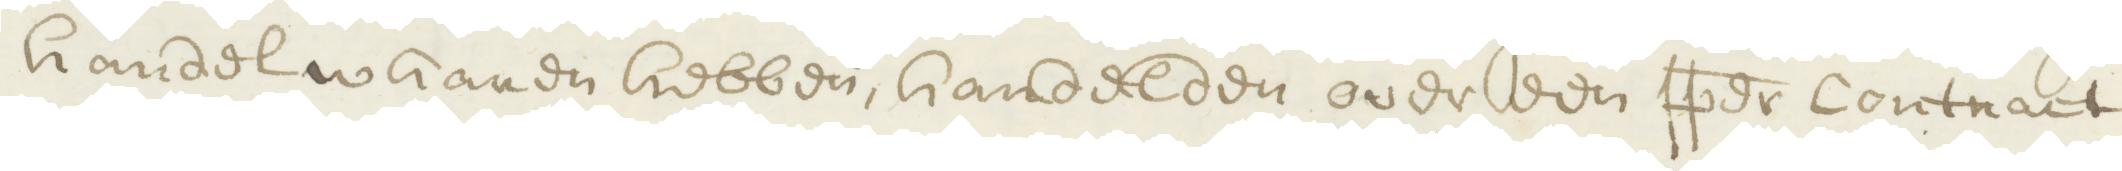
handelwaaren hebben, handelden over een pper contract
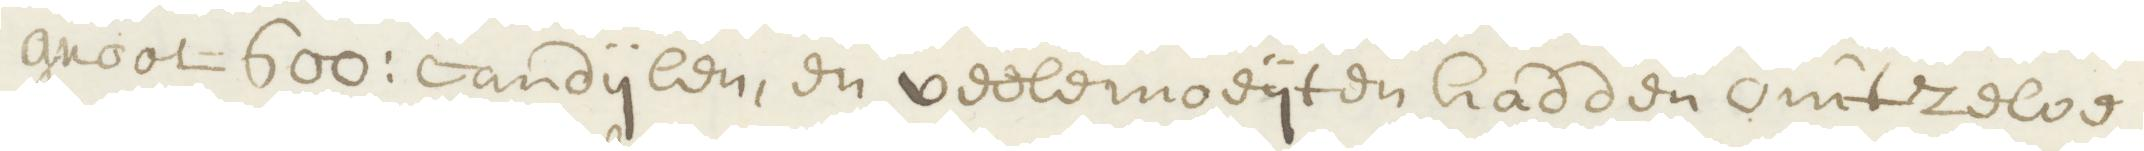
groot 600: candijlen, en veele moeijten hadden om'tzelve
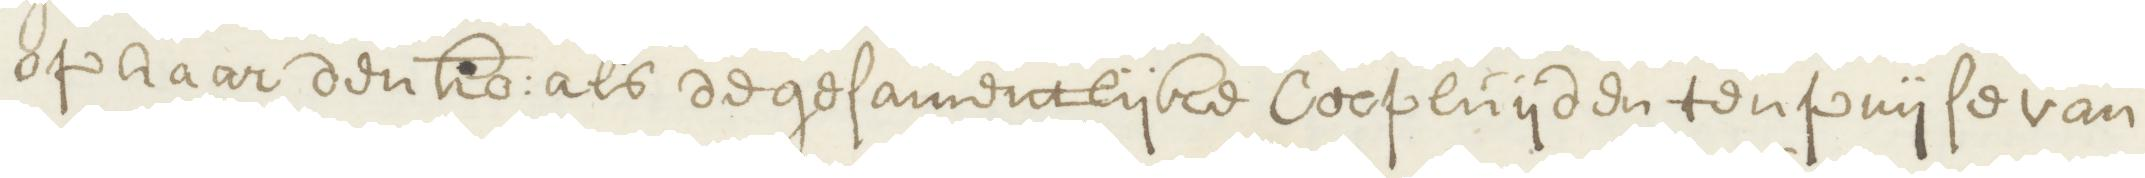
op haar den ho: als de gesamentlijke coopluijden ten prijse van
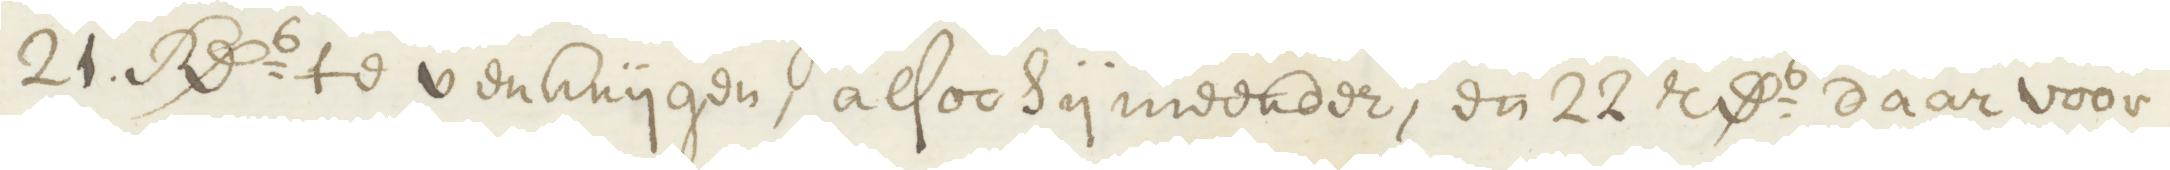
21. Rd=s te verkrijgen, alsoo sij meerder, en 22 rd=s daar voor
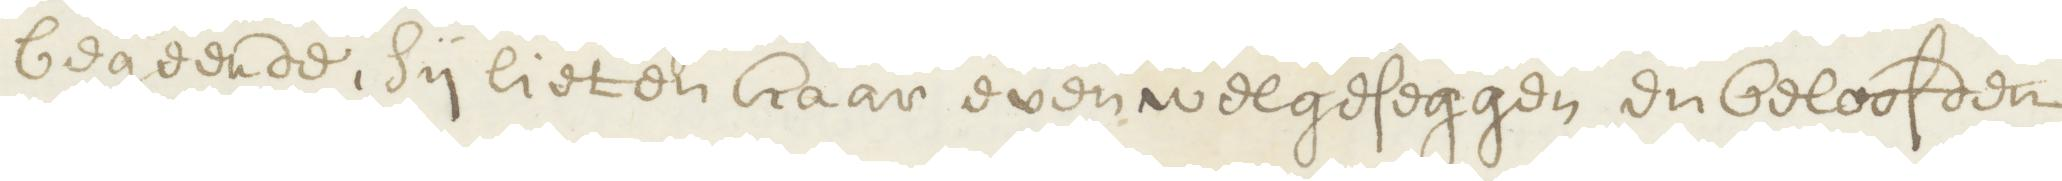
begeerde, sij lieten haar even welgeseggen en beloofden
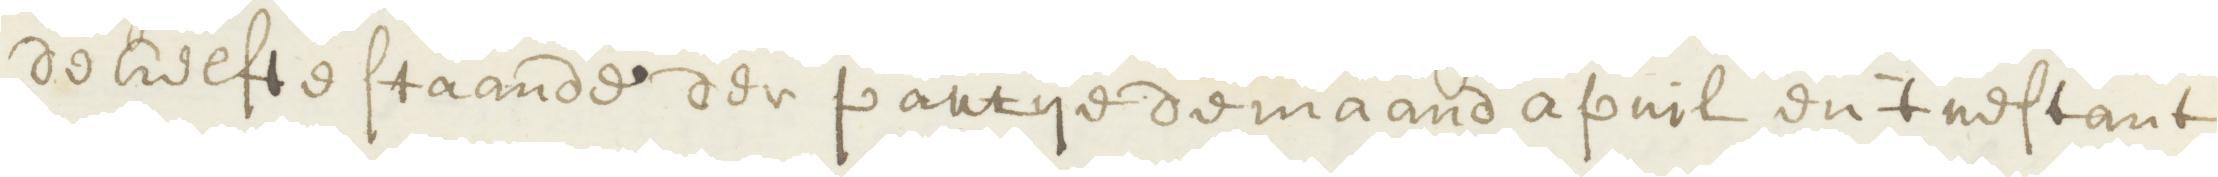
de helfte staande der partije de maand april en ’t restant
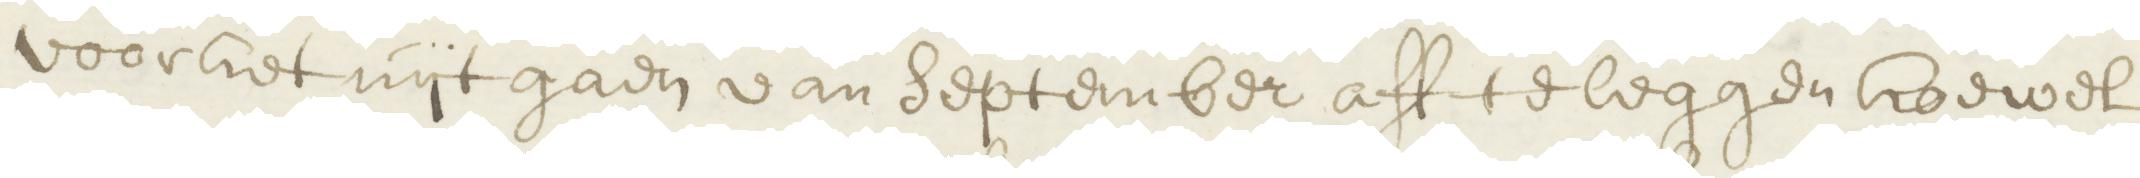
voor het uijtgaen van september aff te leggen hoewel
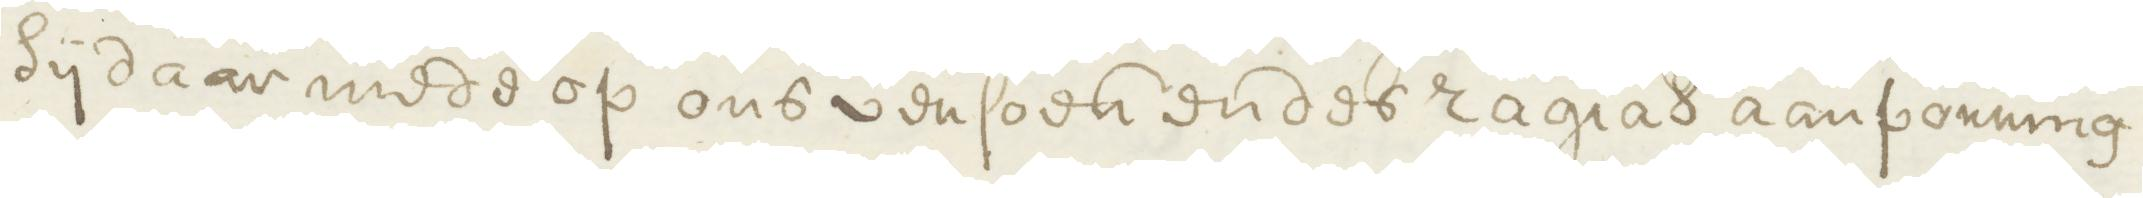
sij daar mede op ons versoek en des ragias aanporring
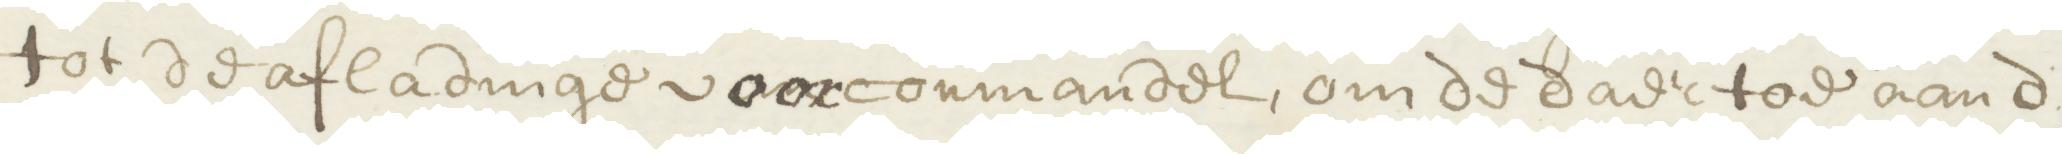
tot de afladinge voor cormandel, om de daertoe aan d
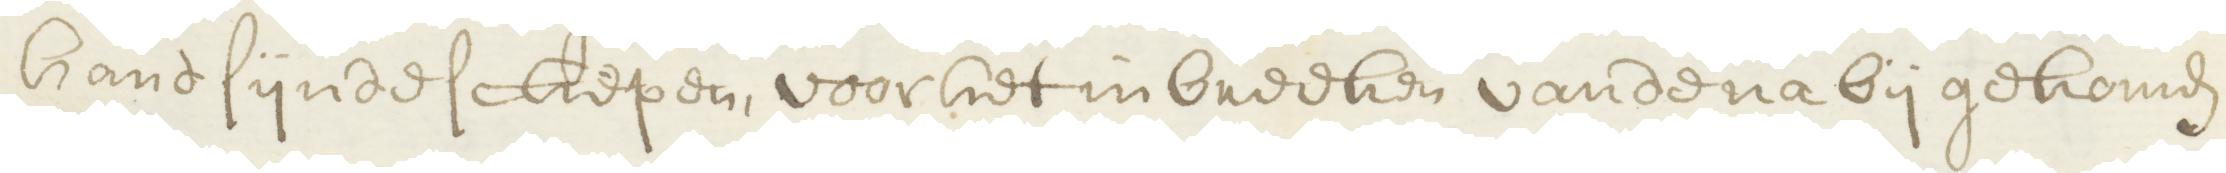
hand sijnde schepen, voor het in breeken van de na bij gekomen
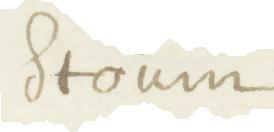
storm
